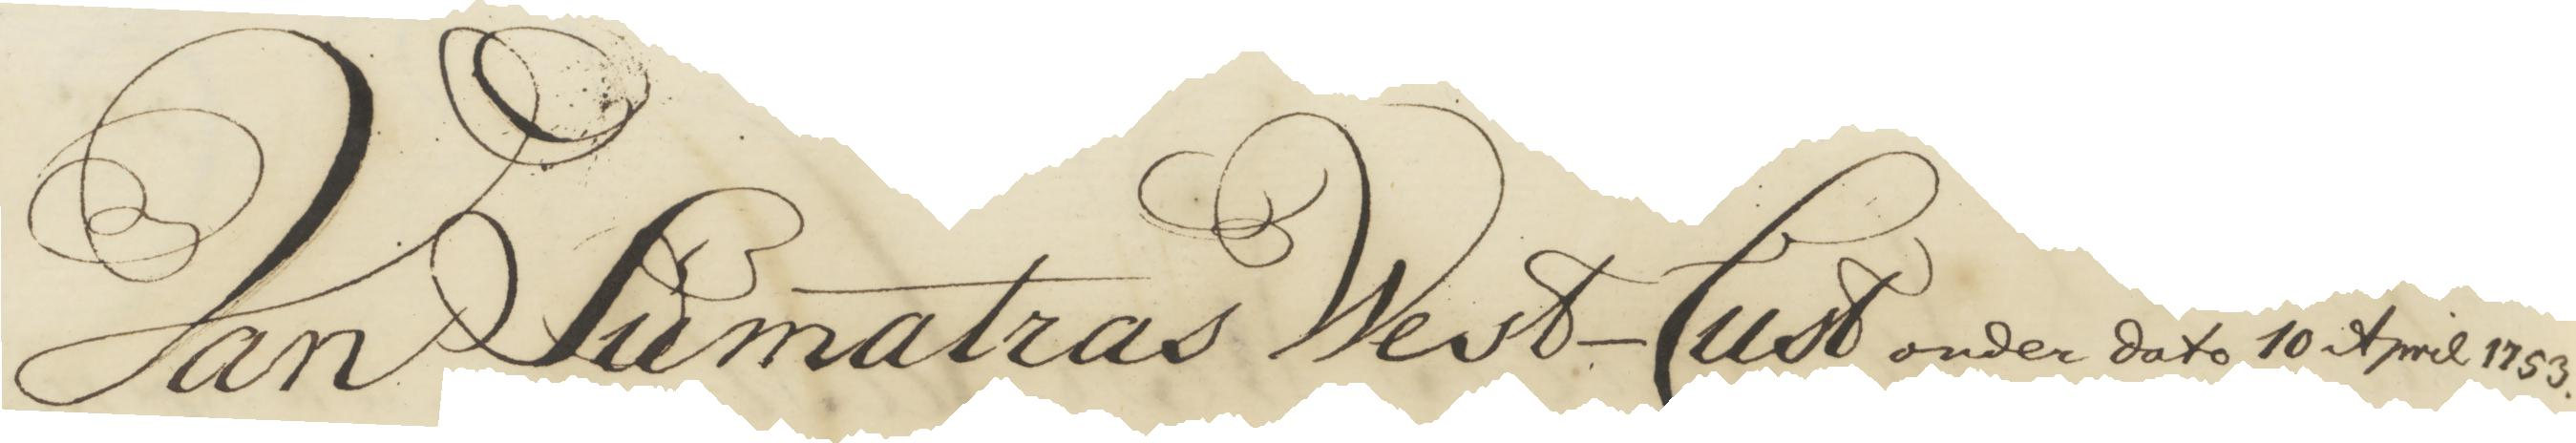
Van Sumatras West-Cust onder dato 10. April 1753.
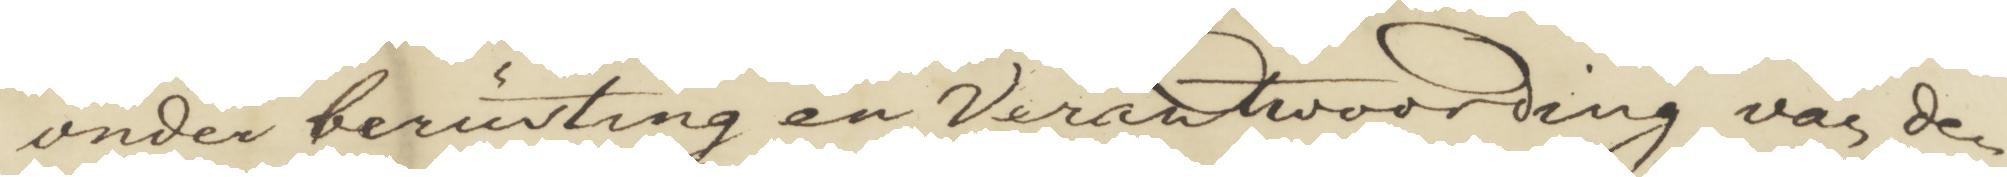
onder berusting en verantwoording van den
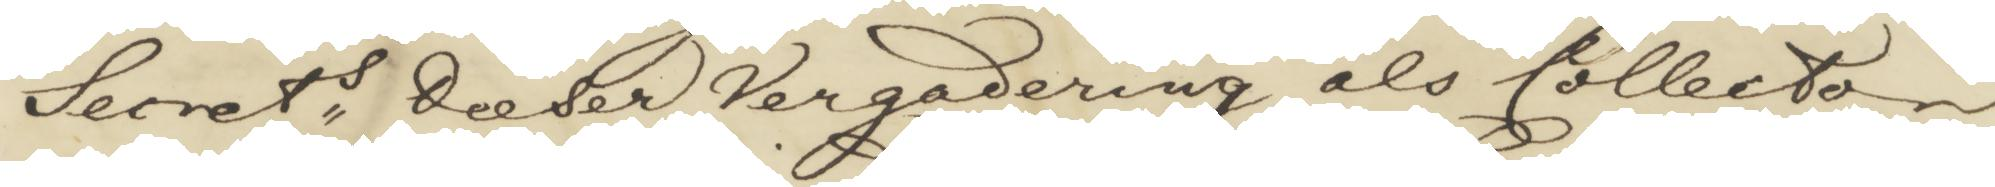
secret„s deeser vergadering als Collector
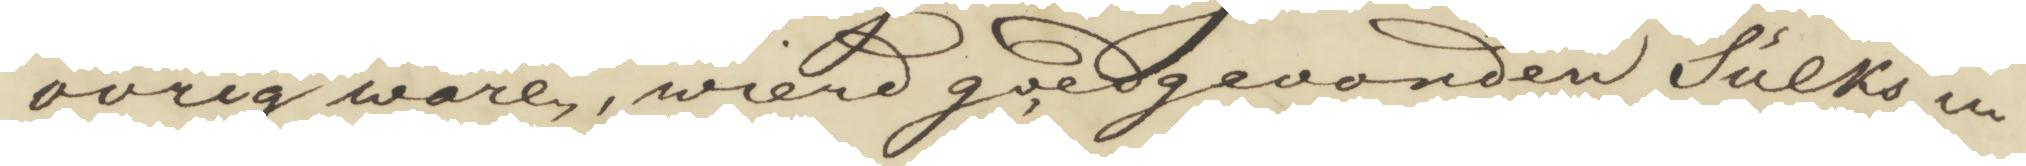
ovrig waren, wierd goed gevonden sulks in
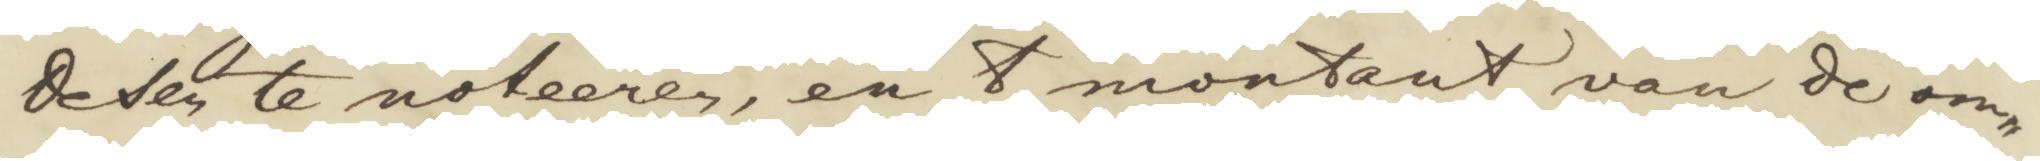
desen te noteeren, en 't montant van de om„
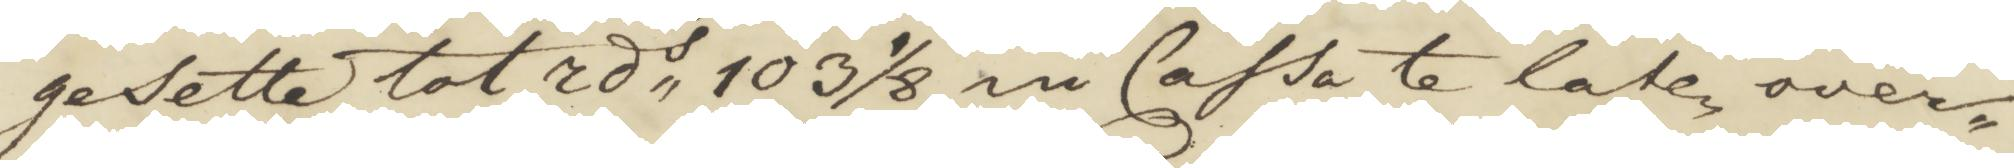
gesette tot rd„s 103 1/8 in Cassa te laten over„
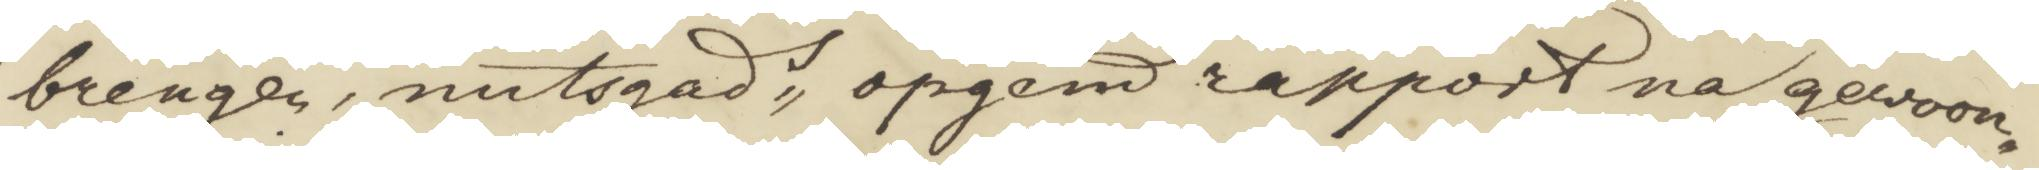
brengen, mitsgad„s opgem rapport na gewoon„
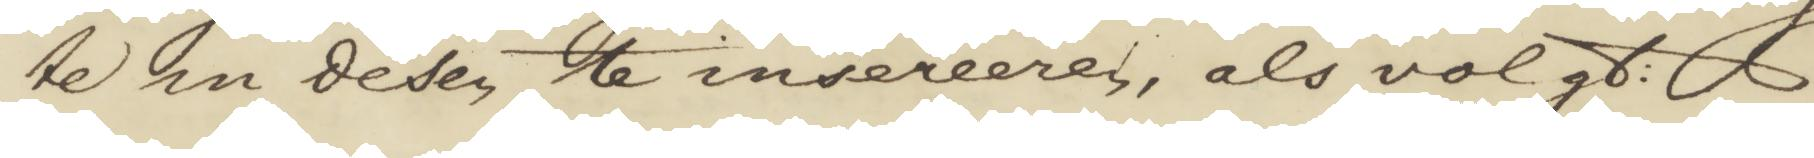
te in desen te insereeren, als volgt:
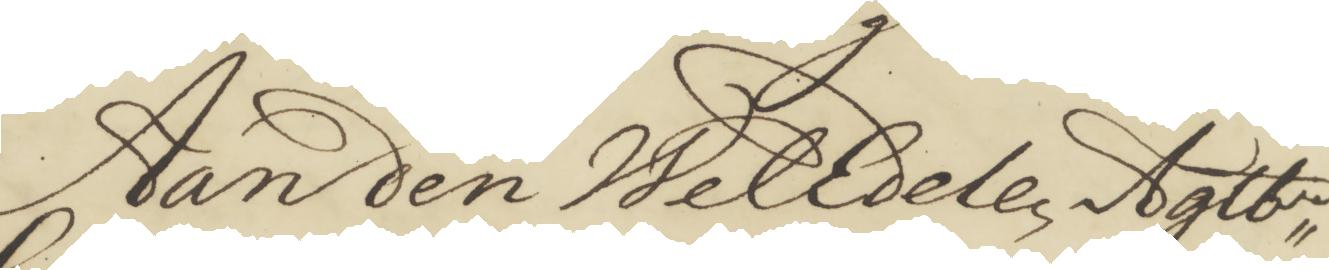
Aan den WelEdelen Agtb„r
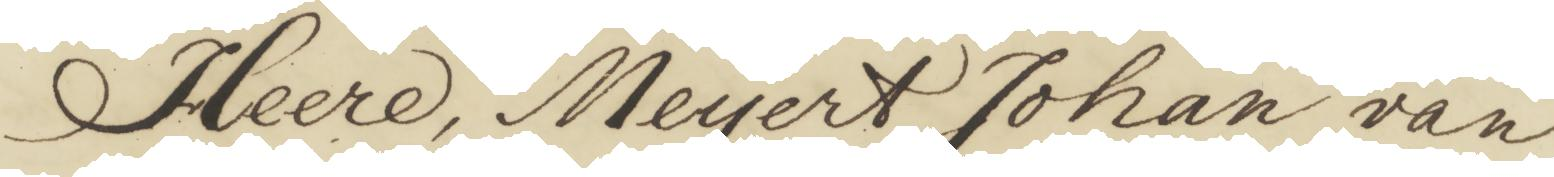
Heere, Meijert Johan van
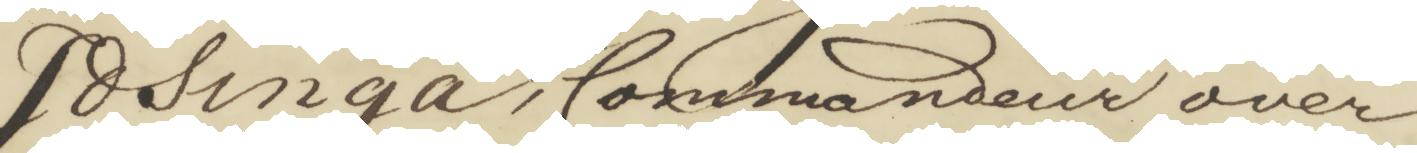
Jdsinga, Commandeur over
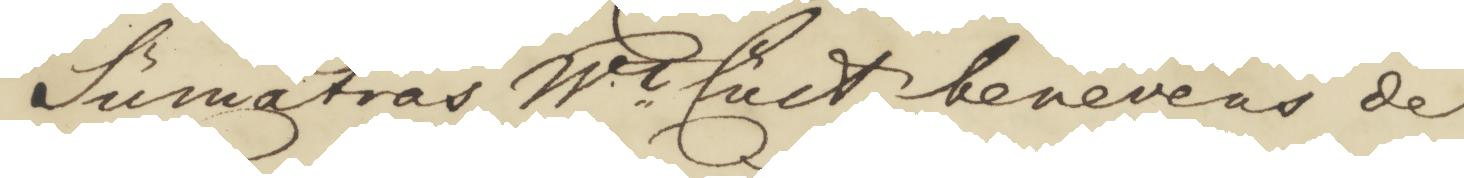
Sumatras W„t Cust benevens de
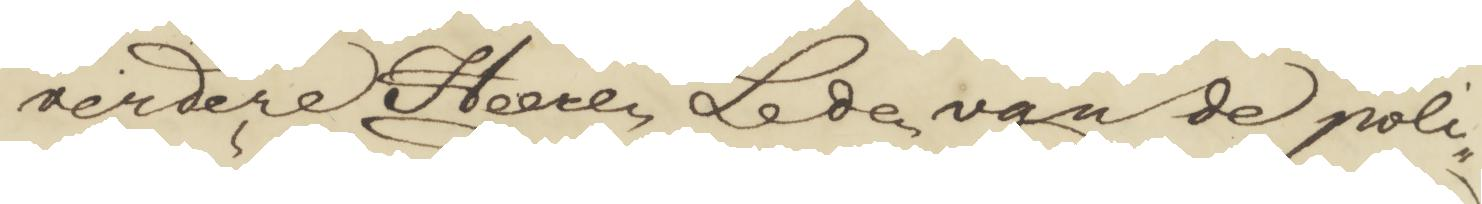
verdere Heeren Leden van de poli„
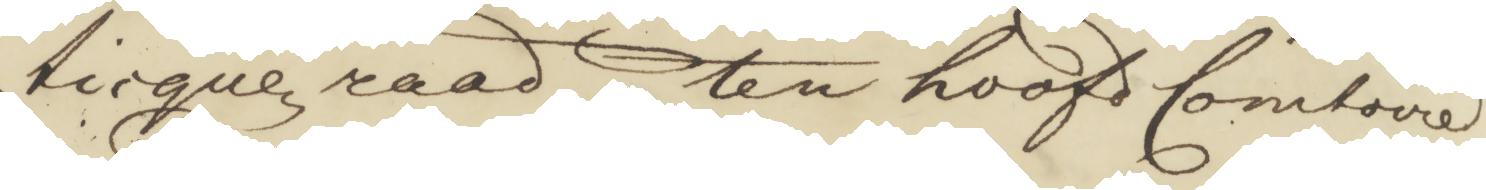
ticquen raad ten hoofd Comtoire
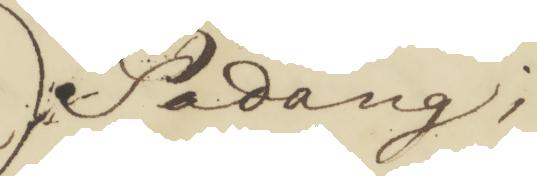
Padang;
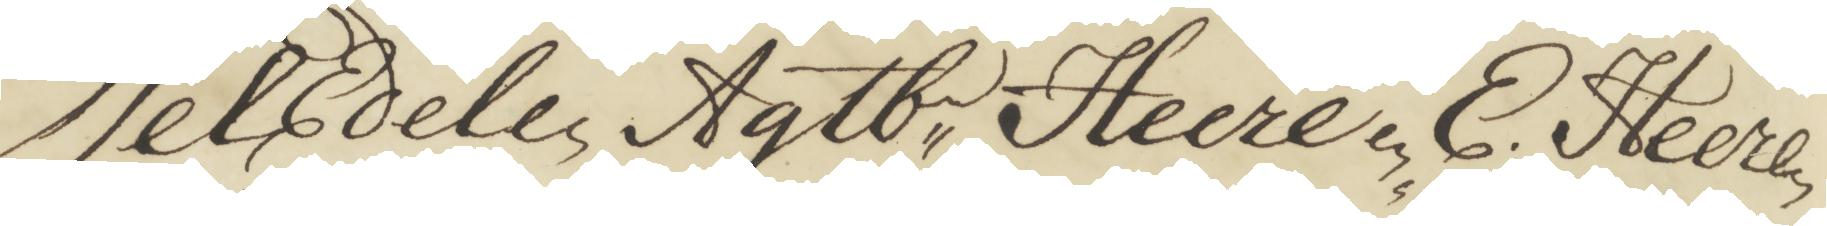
WelEdelen Agtb:n Heere en E. Heeren
